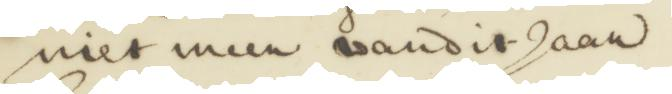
niet meer van dit Jaar
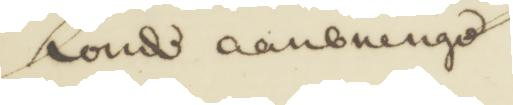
konde aanbrenge
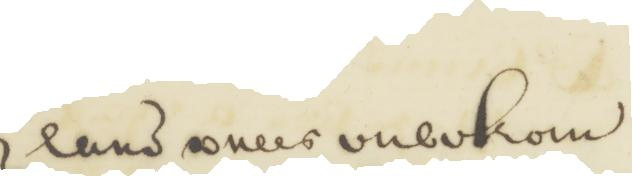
hare vrees en bekom
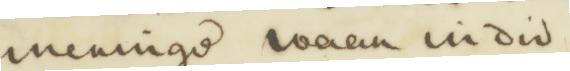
meringe waar in die
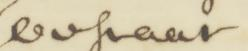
bestaat
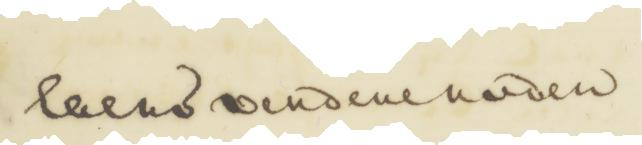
haere verdere reden
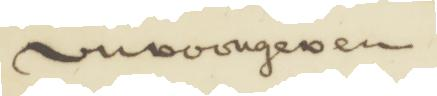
en voorgeven
